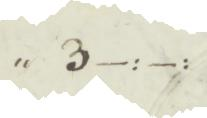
„ 3 —: —:
